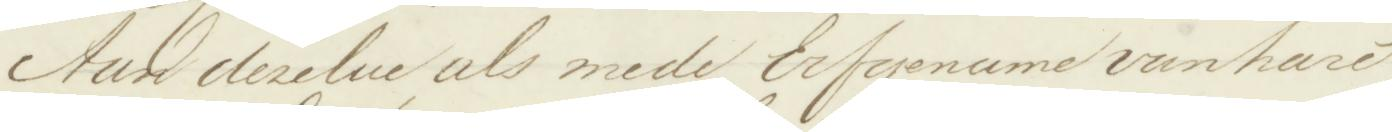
Aan dezelve als mede Erfgename van hare
